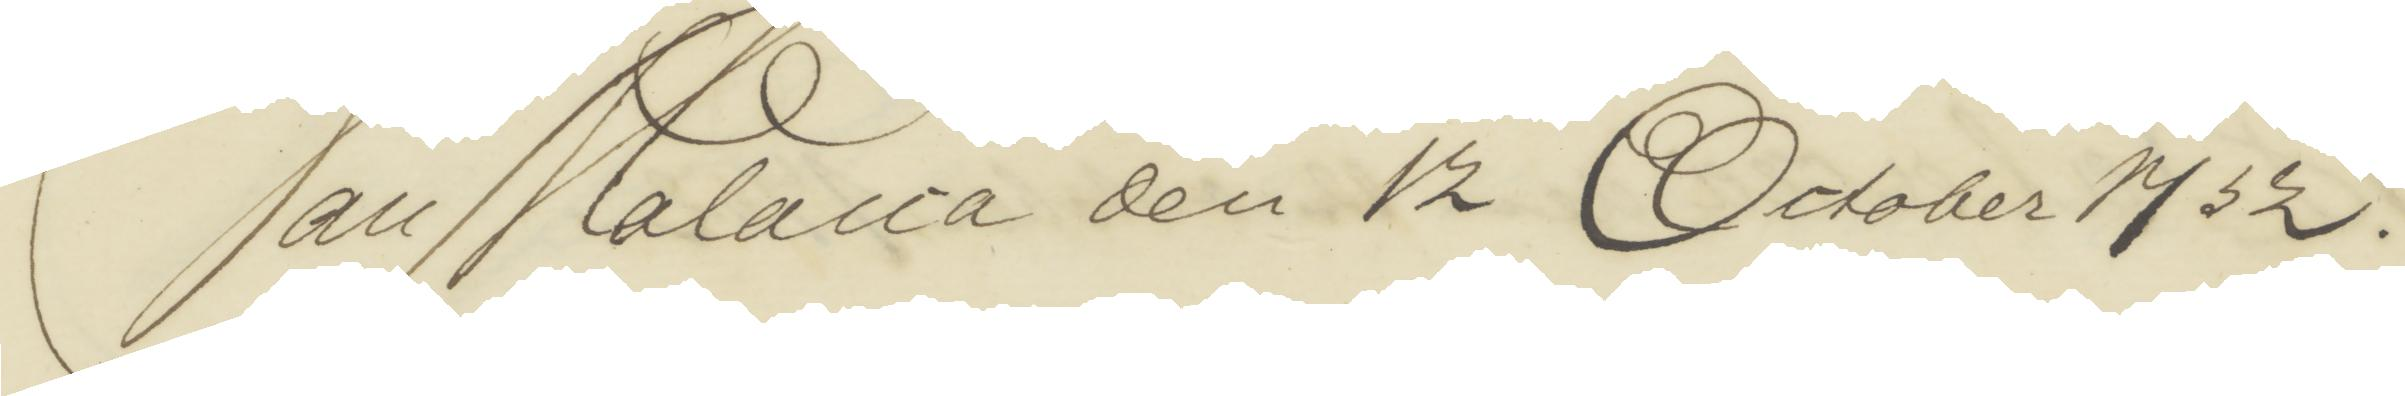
Van Malacca den 12 October 1752.
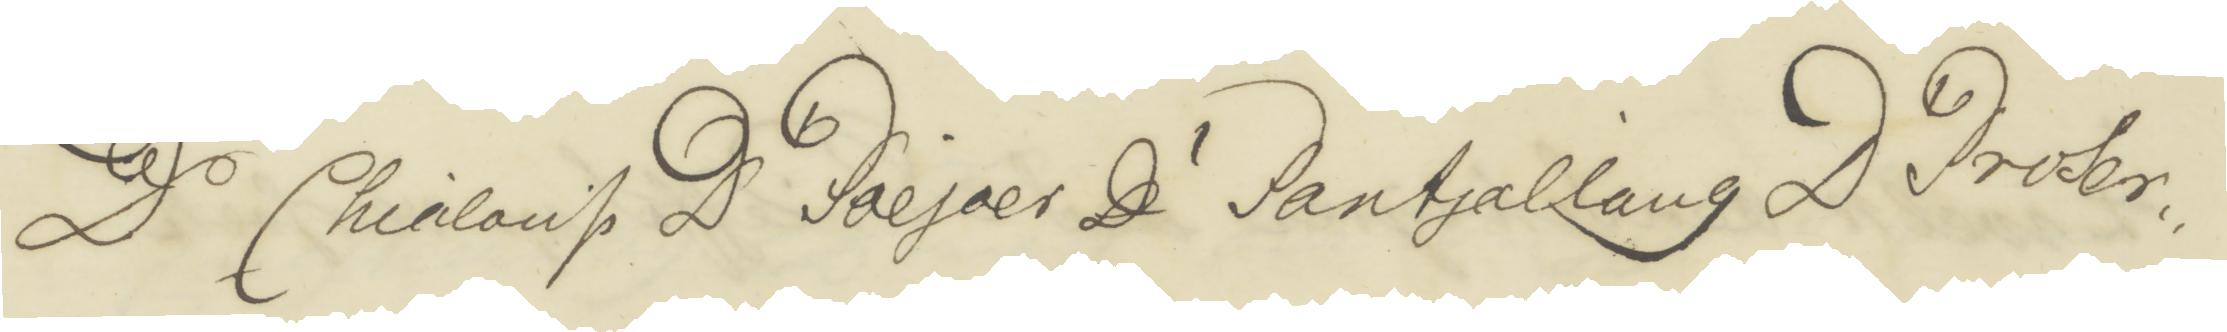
D' Chialoup D' Poejoer D' Pantjallang D' Proser„
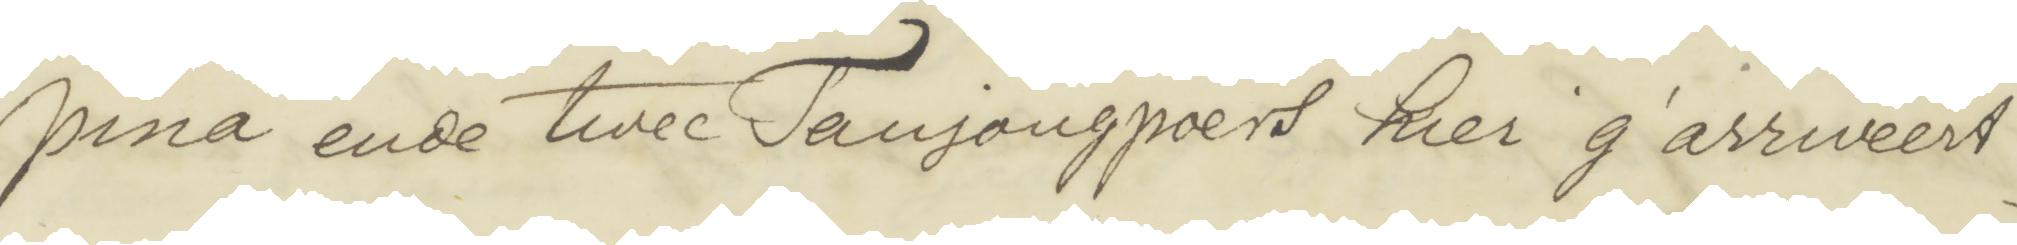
pina ende twee Tanjongpoers hier g’arriveert
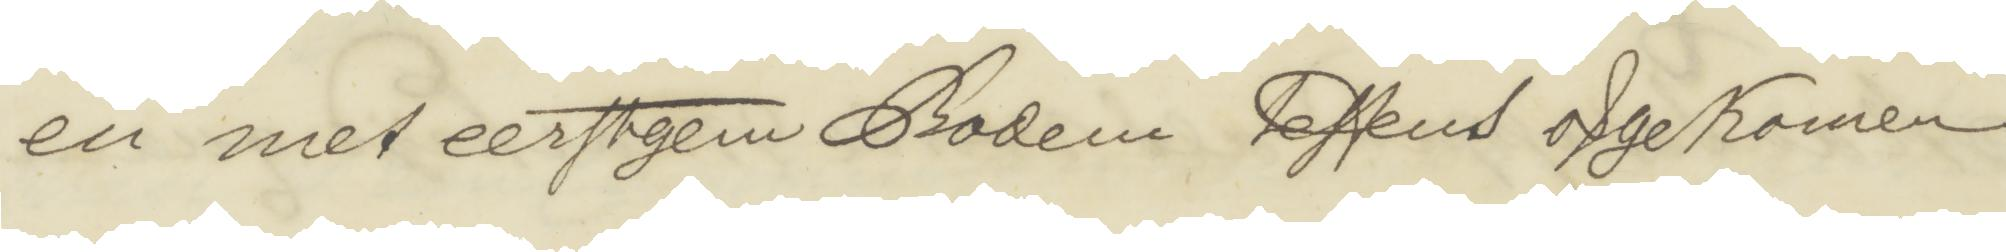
en met eerstgem Bodem teffens overgekomen
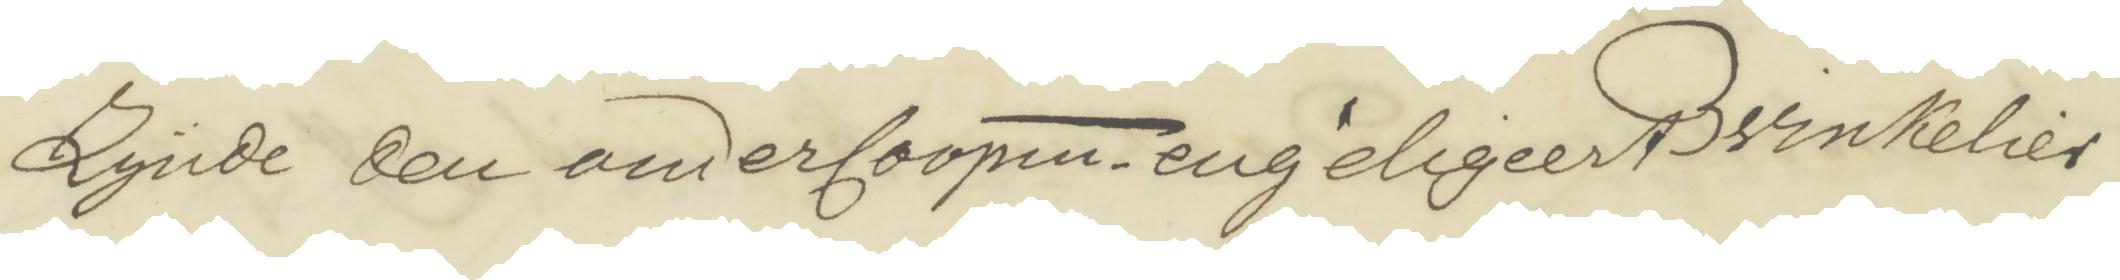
zijnde den ondercoopm: en g'eligeert Winkelier
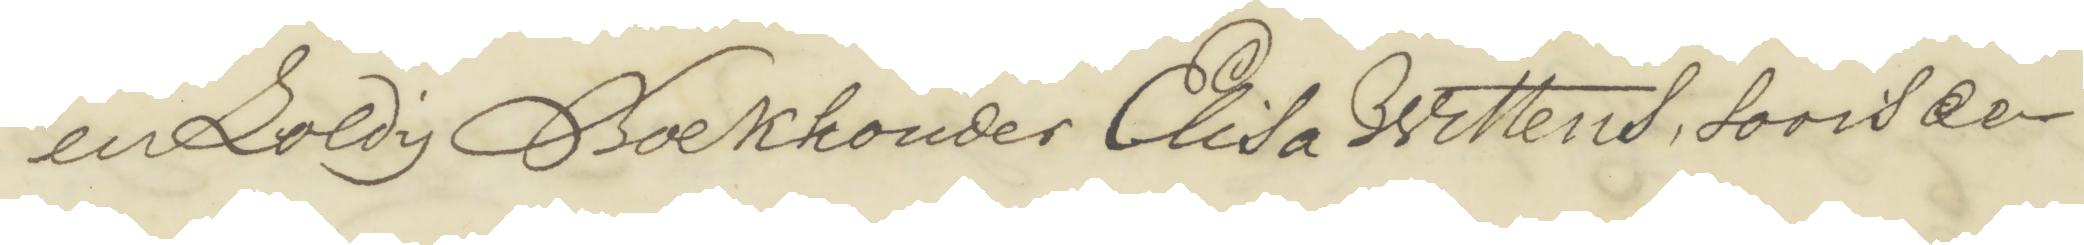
en zoldij Boekhouder Elisa Wittens, soois den
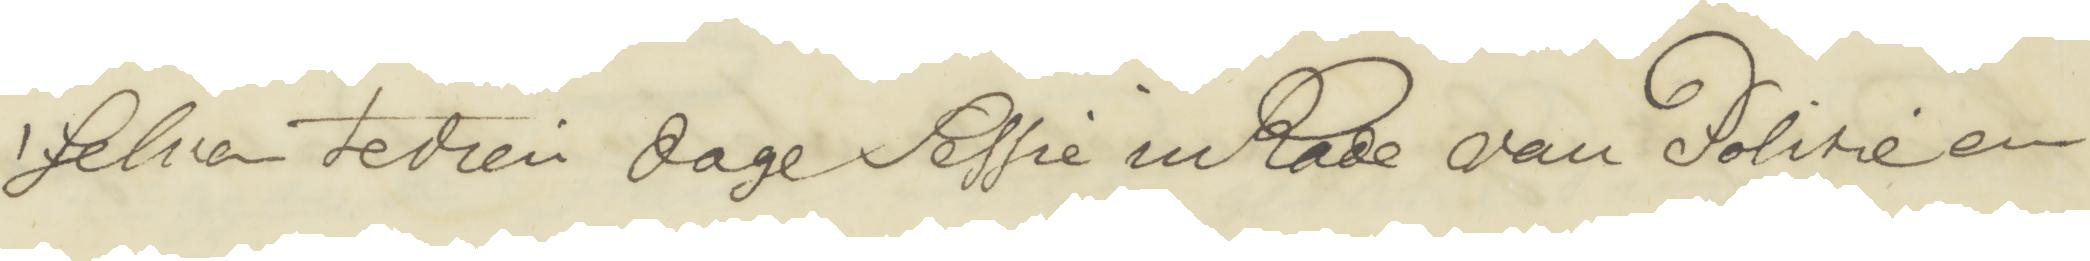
'selven tedien dage sessie inRade van Politie en
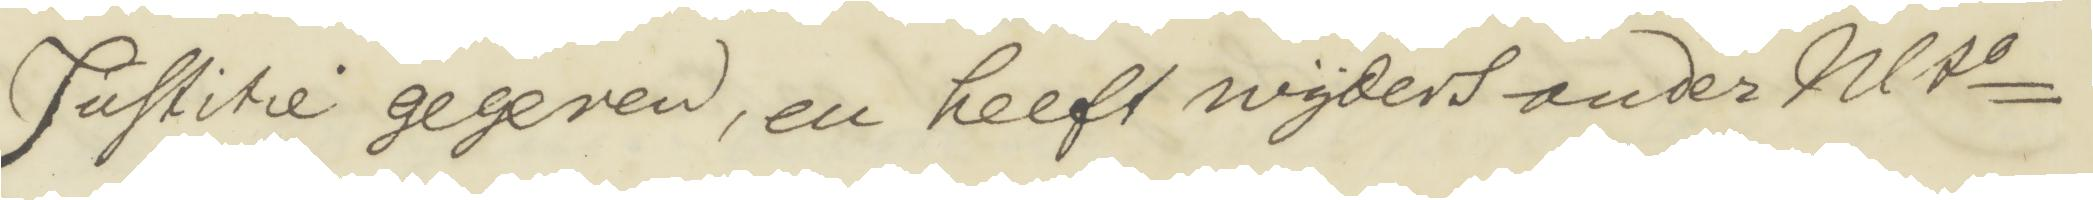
Justitie gegeven, en heeft wijders onder Ult=o
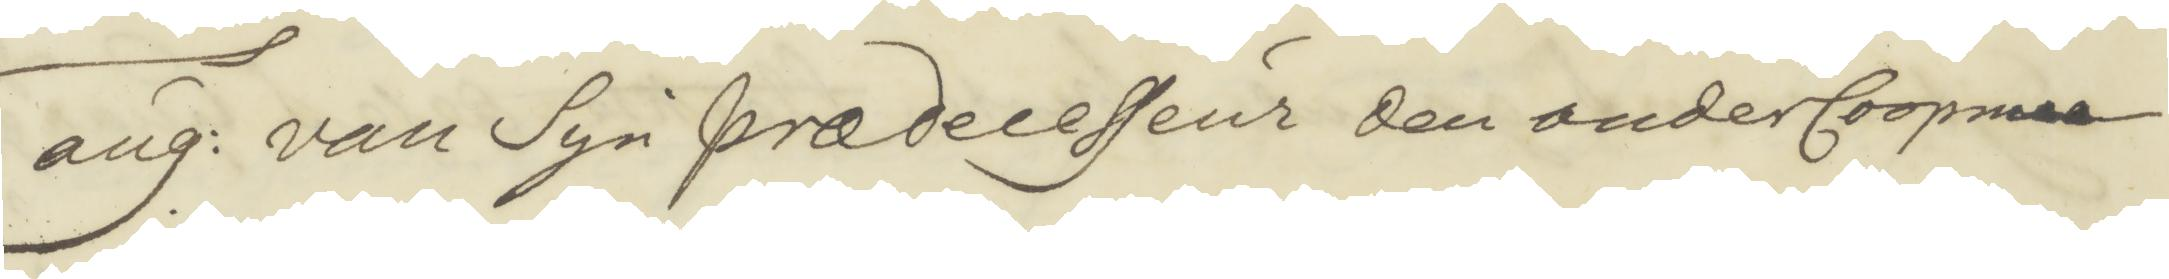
aug:s van sijn praedecesseur den ondercoopman
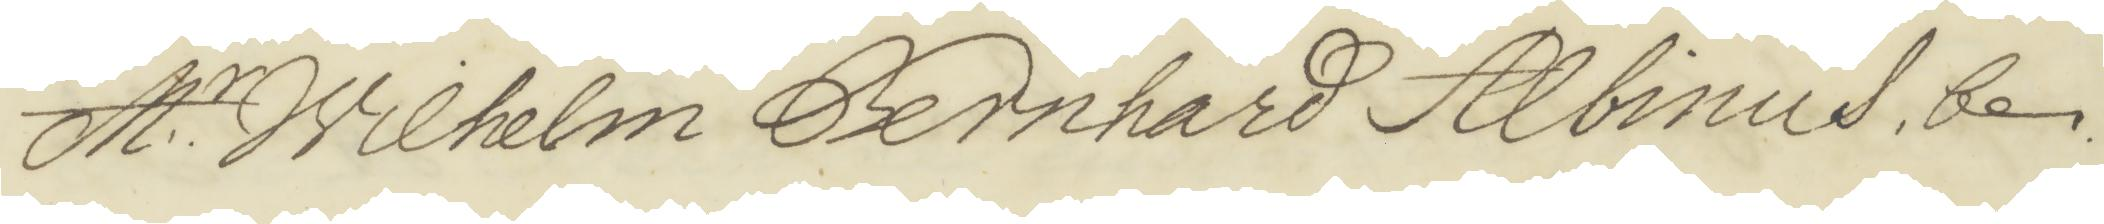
M:r Wilhelm Bernhard Albinus, be
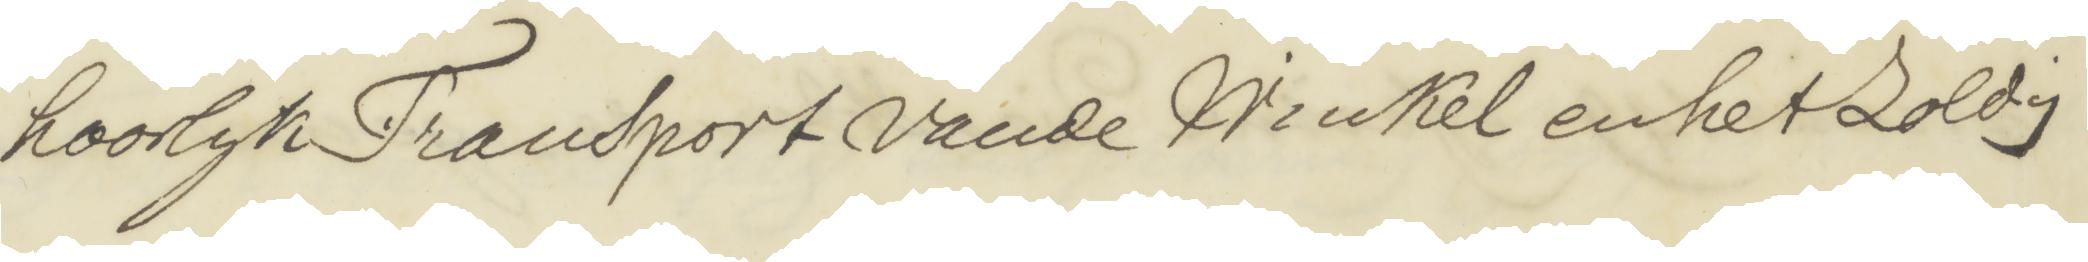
hoorlyk Transport vande Winkel en het zoldij
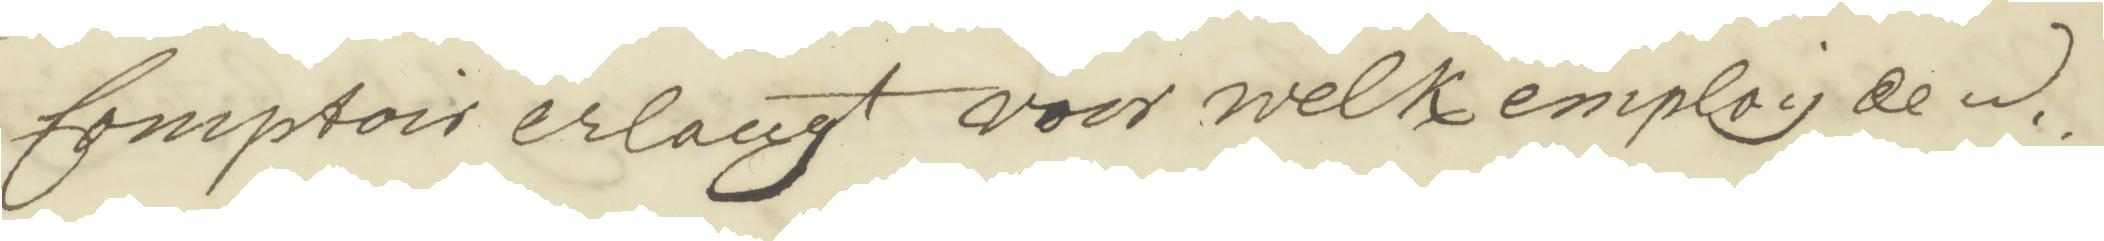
Comptoir erlangt voor welk emploij den„
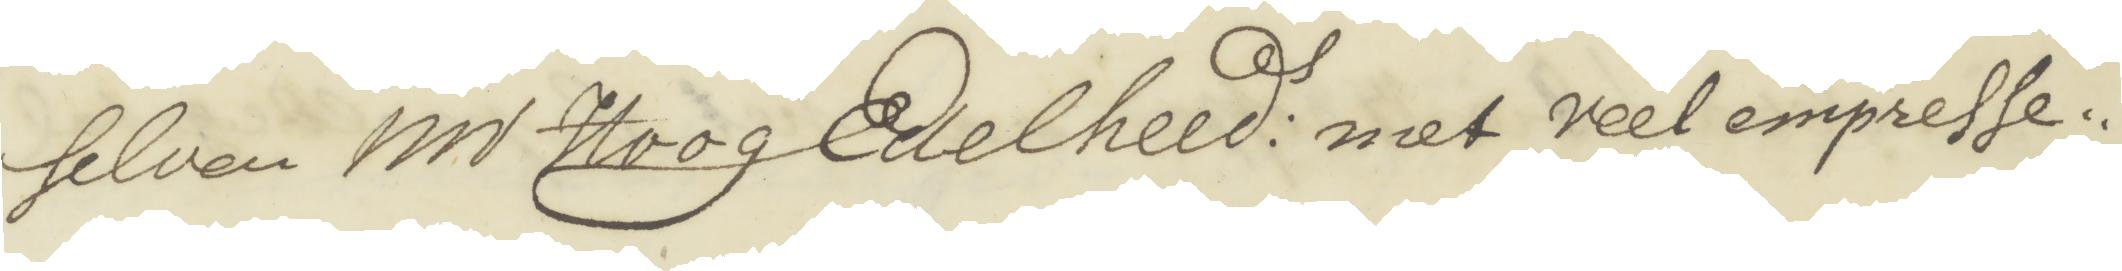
selven uw Hoog Edelheed:s met veel empresse„
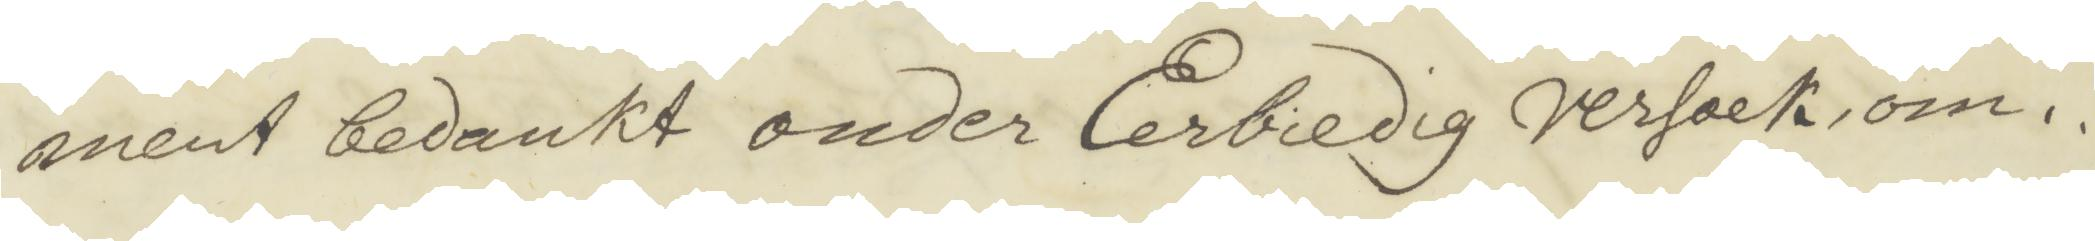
ment bedankt onder Eerbiedig versoek, om„
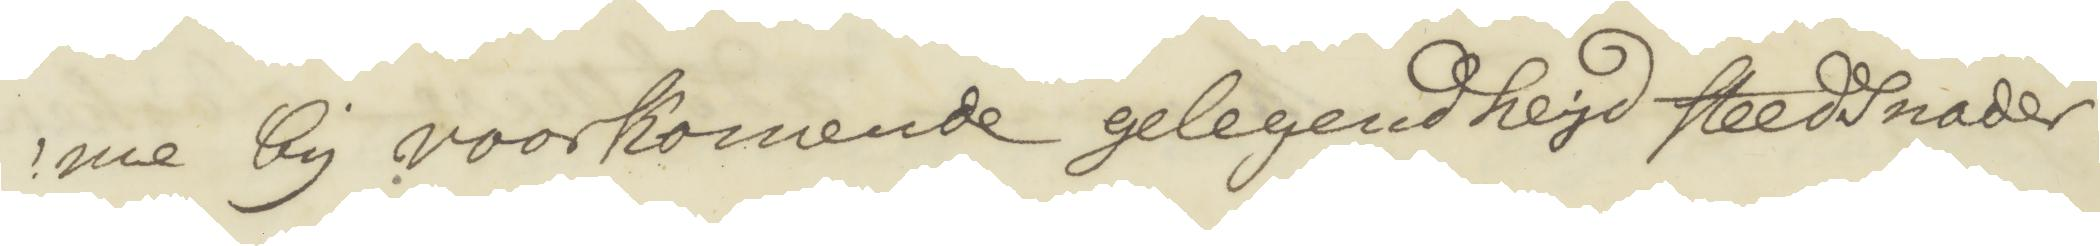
„me bij voorkomende gelegendheijd steeds nader
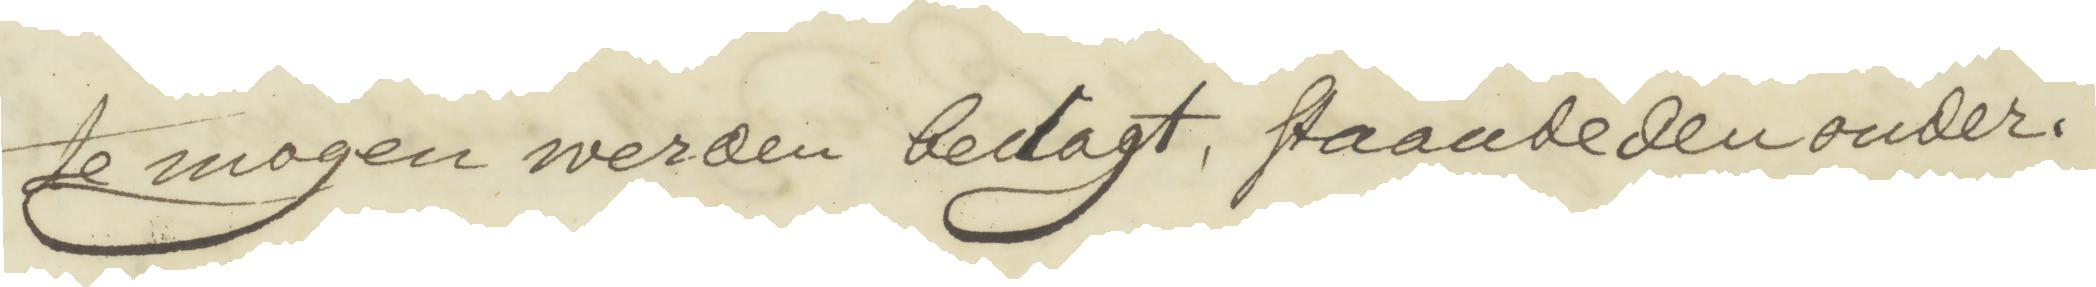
te mogen werden bedagt, staande den onder„
